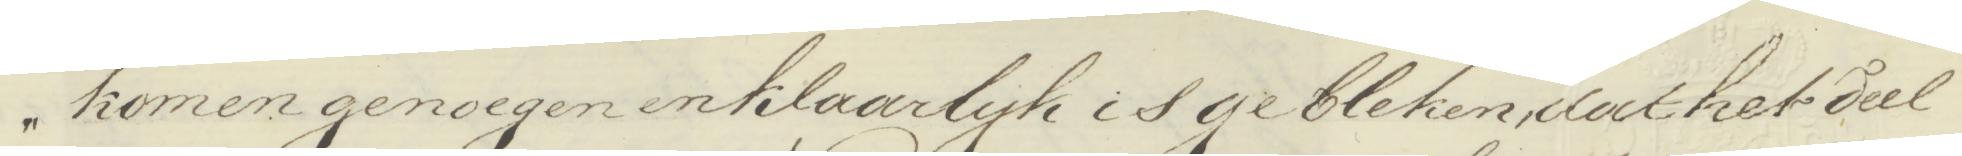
„komen genoegen en klaarlijk is gebleken, dat het deel
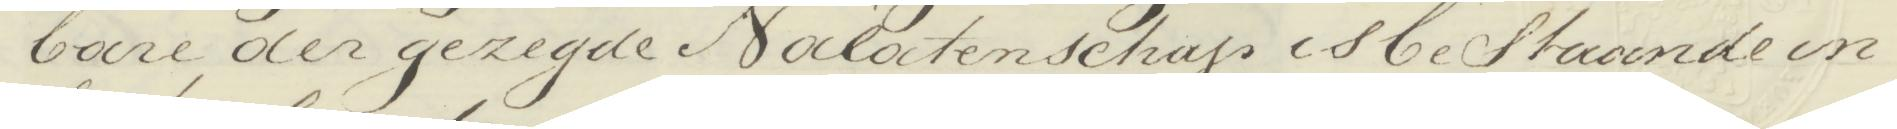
bare der gezegde Nalatenschap is bestaande in
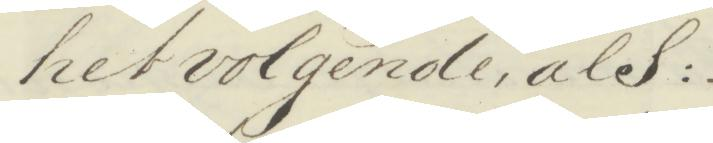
het volgende, als:
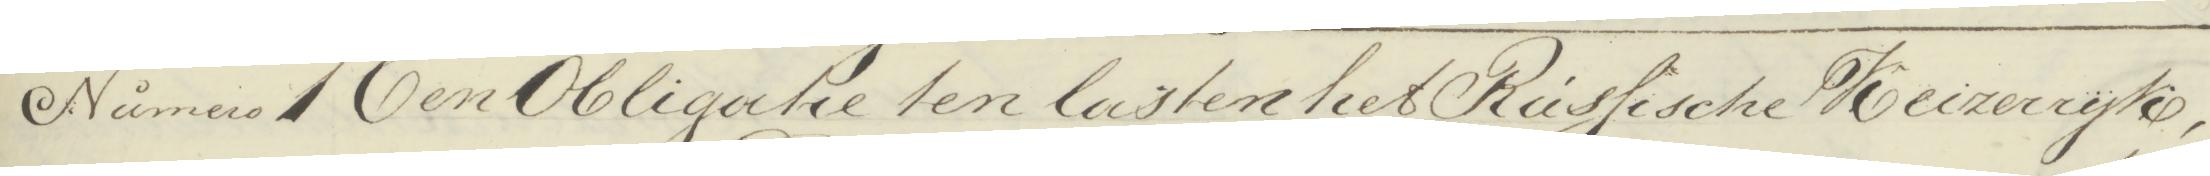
Numero 1 Een Obligatie ten lasten het Russische Keizerrijk,
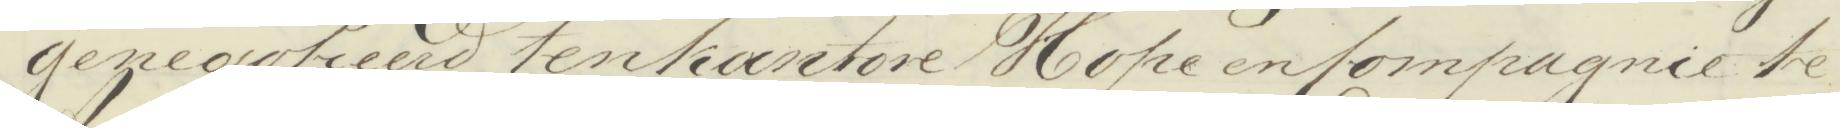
genegotieerd ten kantore Hope en Compagnie te
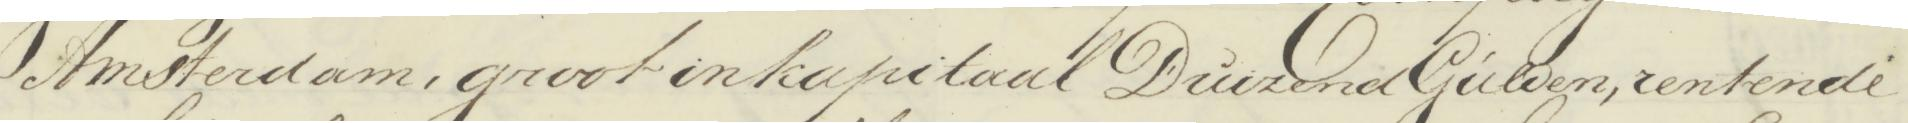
Amsterdam, groot in kapitaal Duizend Gulden, rentende
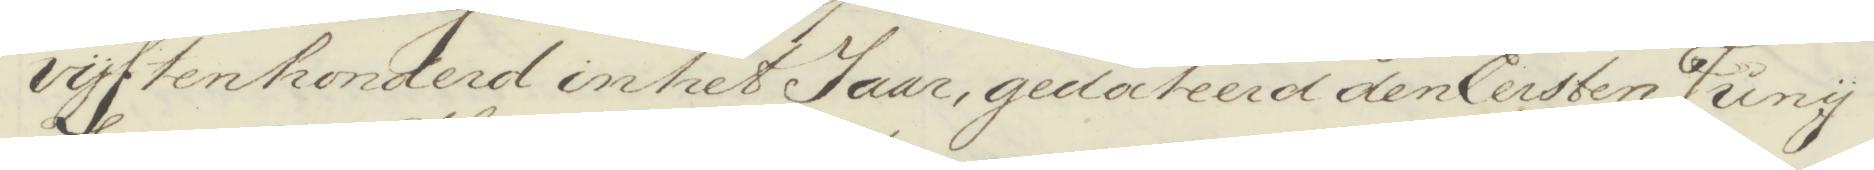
vijften honderd in het Iaar, gedateerd den Eersten Junij
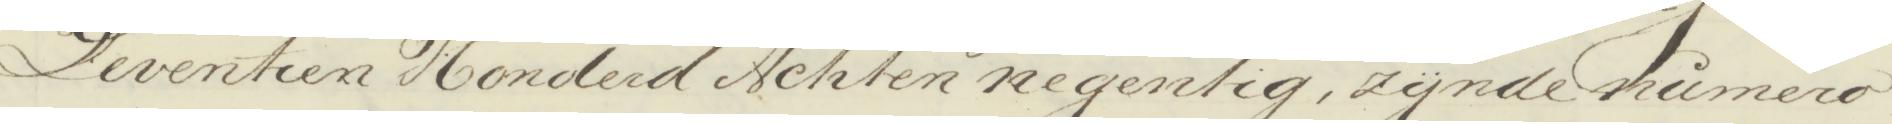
Zeventien Honderd Achten negentig, zijnde numero
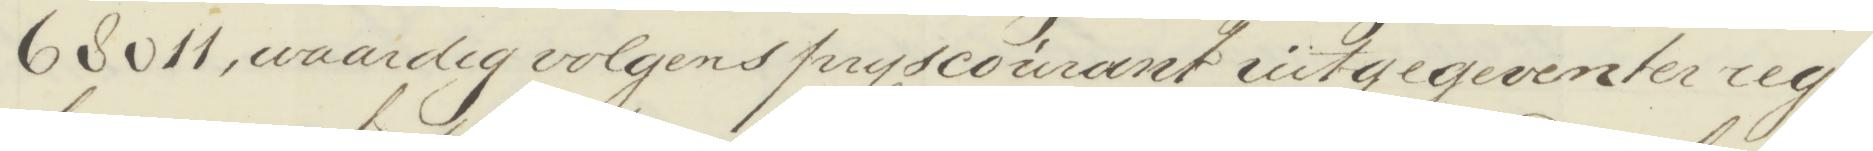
68011, waardig volgens prys courant uitgegeven ter rege
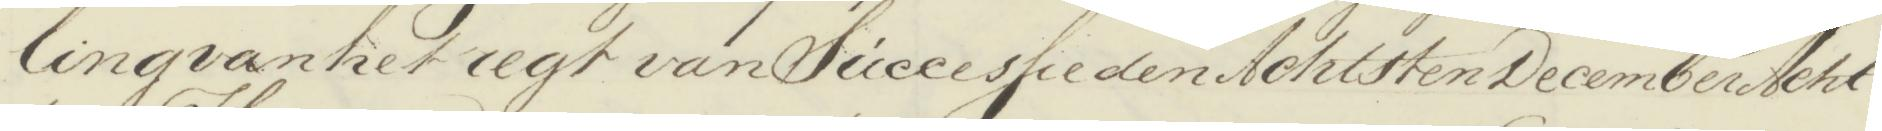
ling van het regt van Successie den Achtsten December Acht
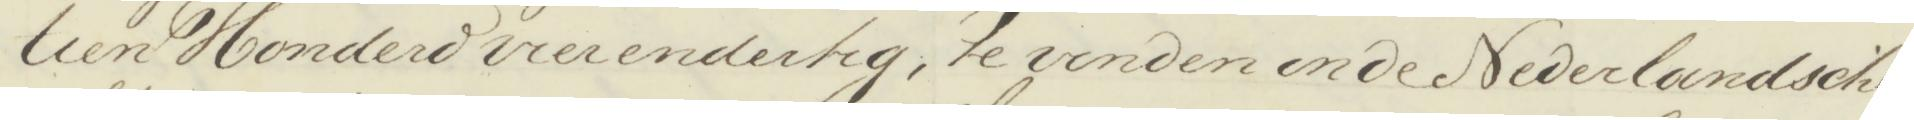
tien Honderd vier en dertig, te vinden in de Nederlandsche
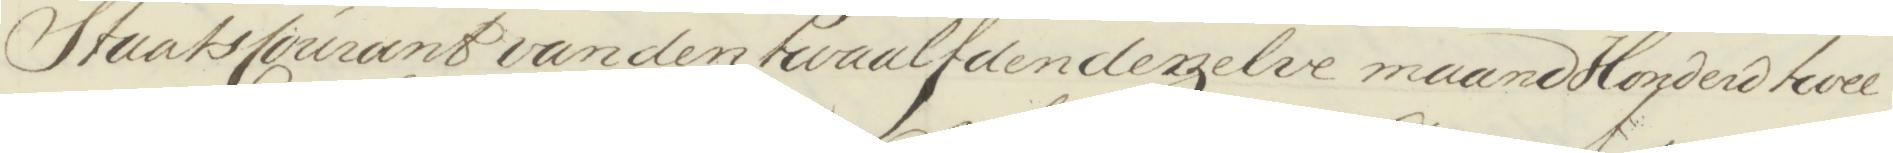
Staats Courant van den twaalfden dezelve maand Honderd twee
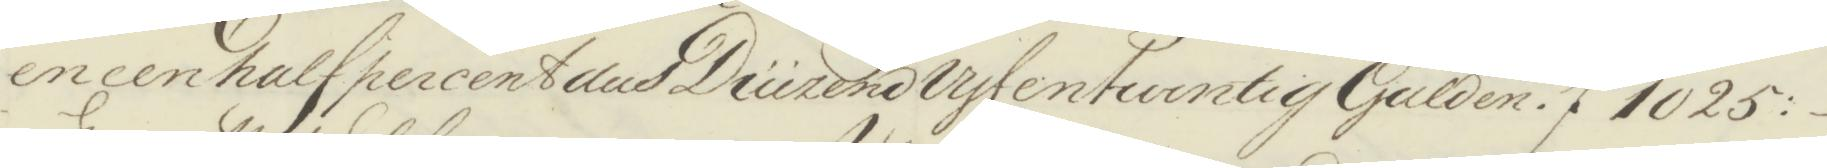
en een half percent dus Duizend Vyfentwintig Gulden. ƒ 1025:—
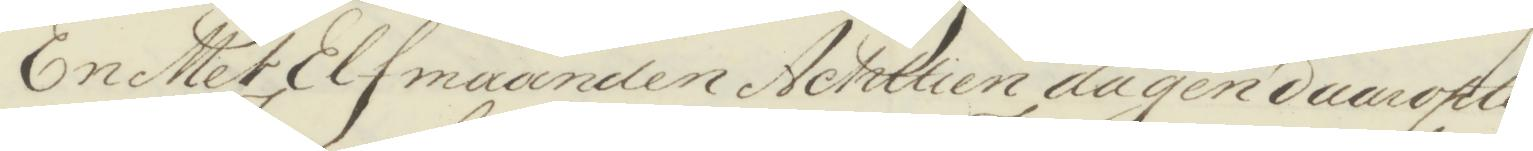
On Met Elf maanden Achttien dagen daarop te
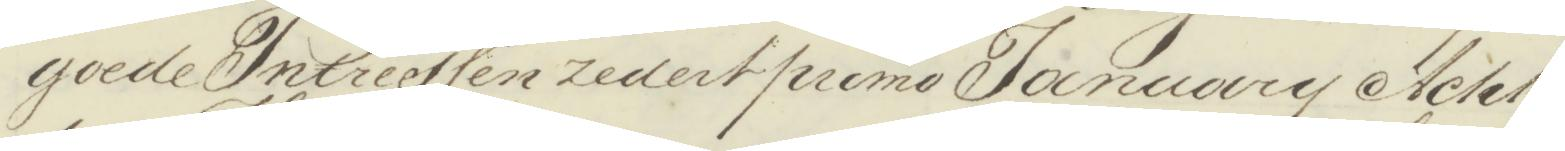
goede Intressen zedert primo Ianuarij Acht
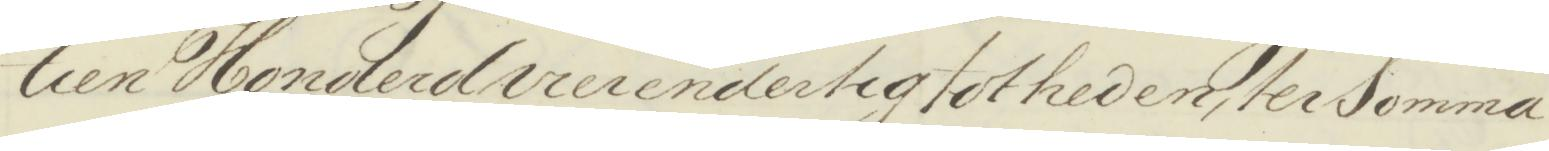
tien Honderd vierendertig tot heden, ter somma
